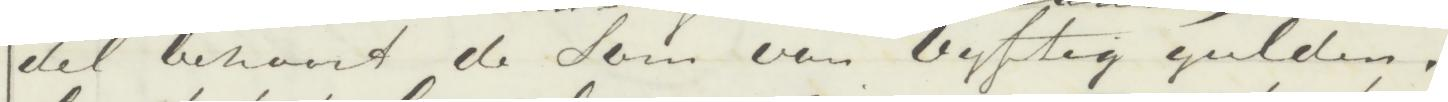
del behoort de som van Vyftig gulden.
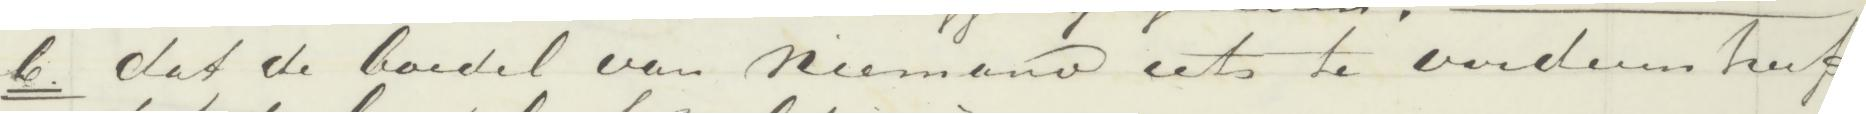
b. dat de boedel van niemand iets te vorderen heeft
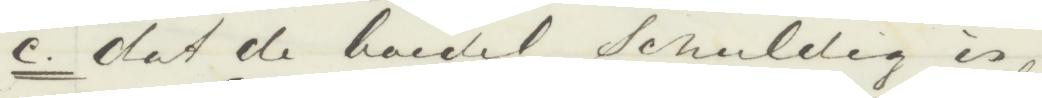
c. dat de boedel schuldig is
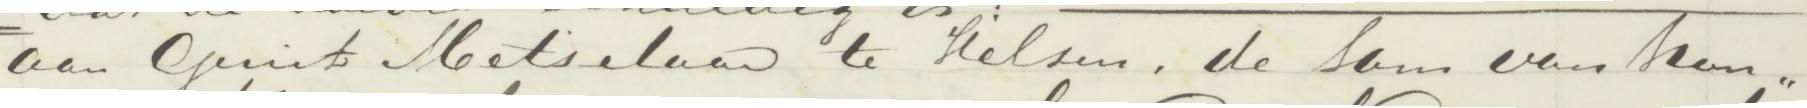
aan Gerrit Metselaar te Velzen, de som van hon
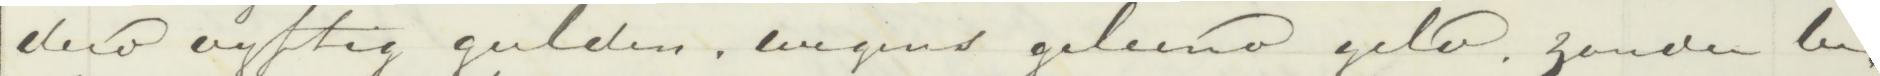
derd vyftig gulden, wegens geleend geld, zonder be„
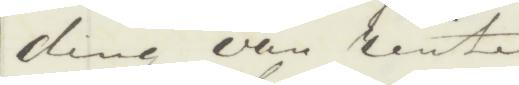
ding van rente
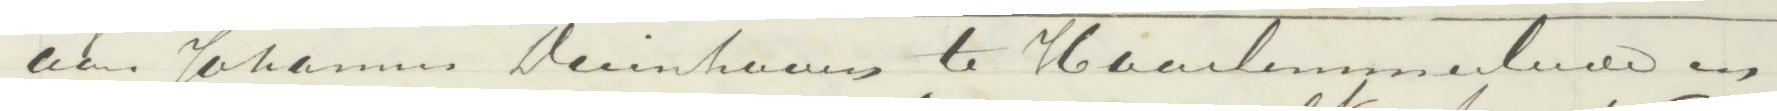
aan Johannes Duinhoven te Haarlemmerliede en
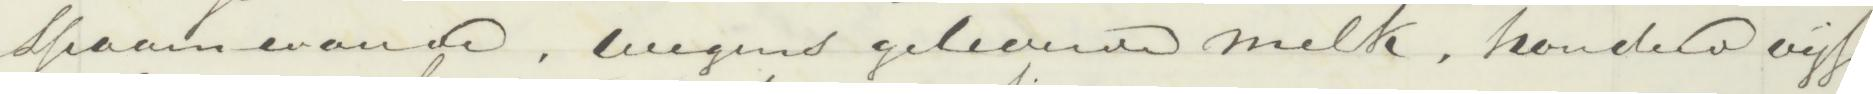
spaarnwoude, wegens geleverde melk, honderd vijf
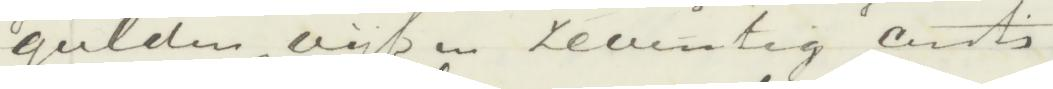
gulden vijf en zeventig cents
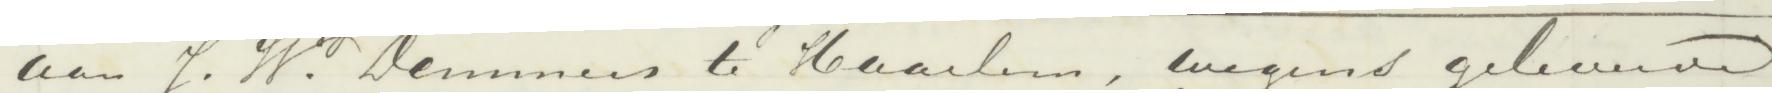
aan J. W: Demmers te Haarlem, wegens geleverde
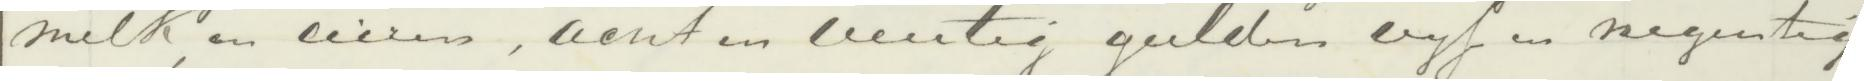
melk en eieren, acht en veertig gulden vyf en negentig
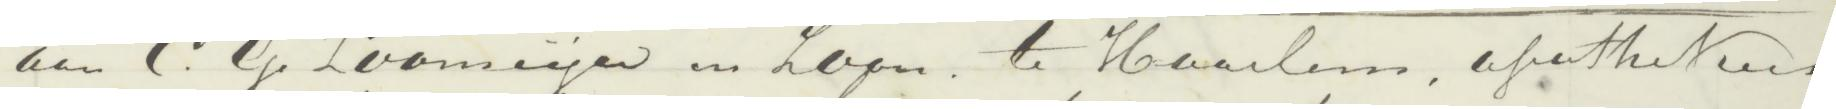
aan C: G Loomeijer en Zoon, te Haarlem, apothekers
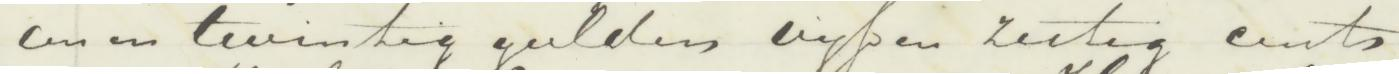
een en twintig gulden vjf en zestig cents
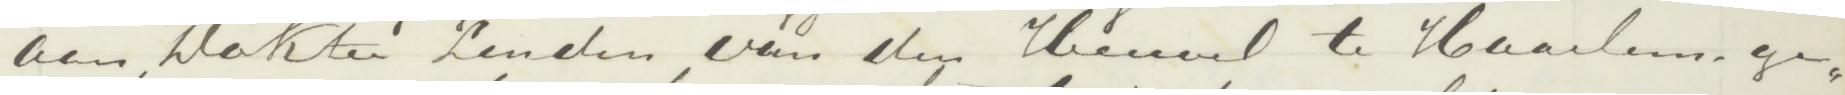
aan Dokter Linden van den Heuvel te Haarlem ge„
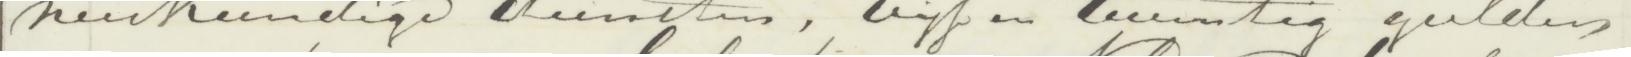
neeskundige diensten, vijf en twintig gulden
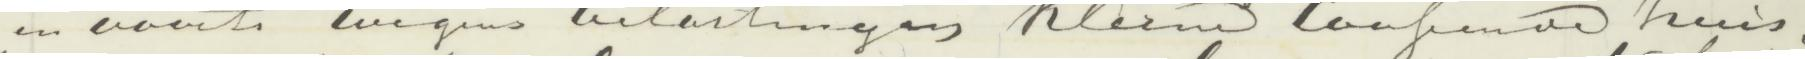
en voorts wegens belasting en kleine loopende huis
